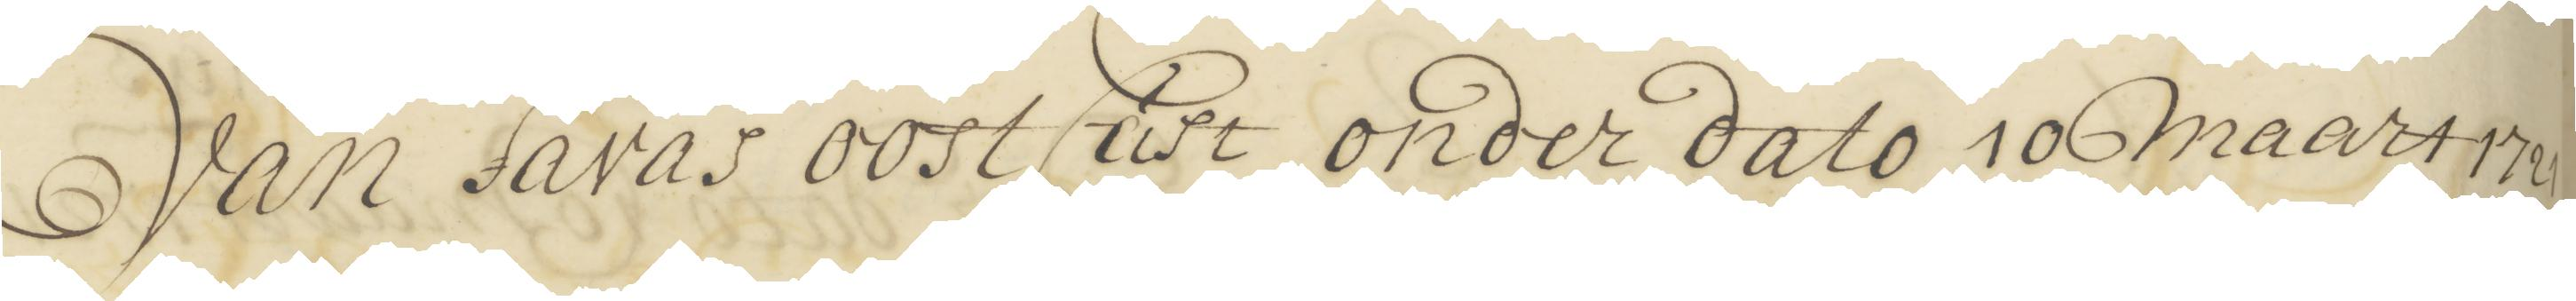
Van Iavas oost Cust onder dato 10 Maart 1721
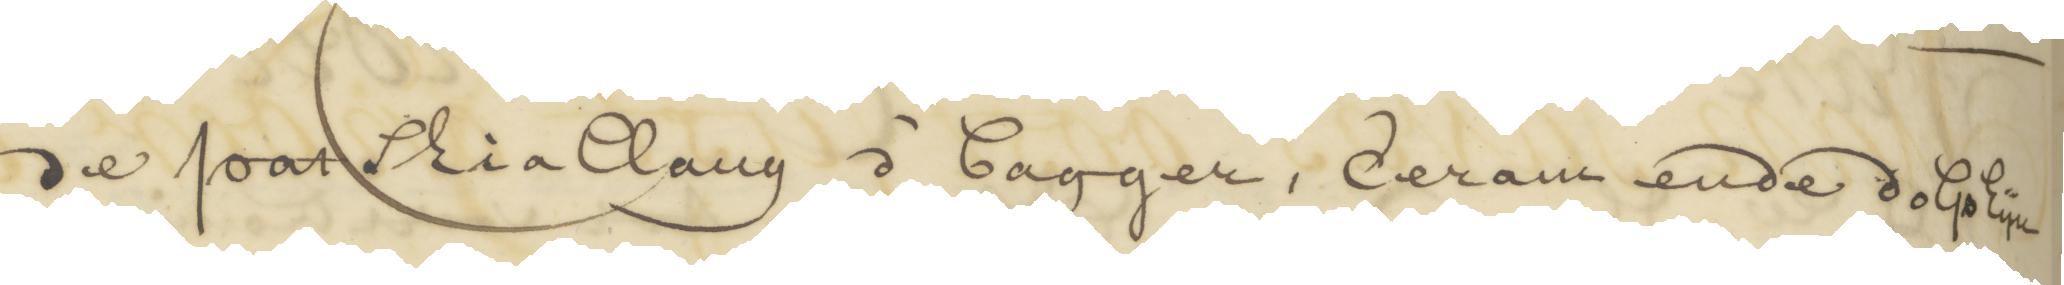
de patshiallang d’ bagger, Ceram ende dolphijn
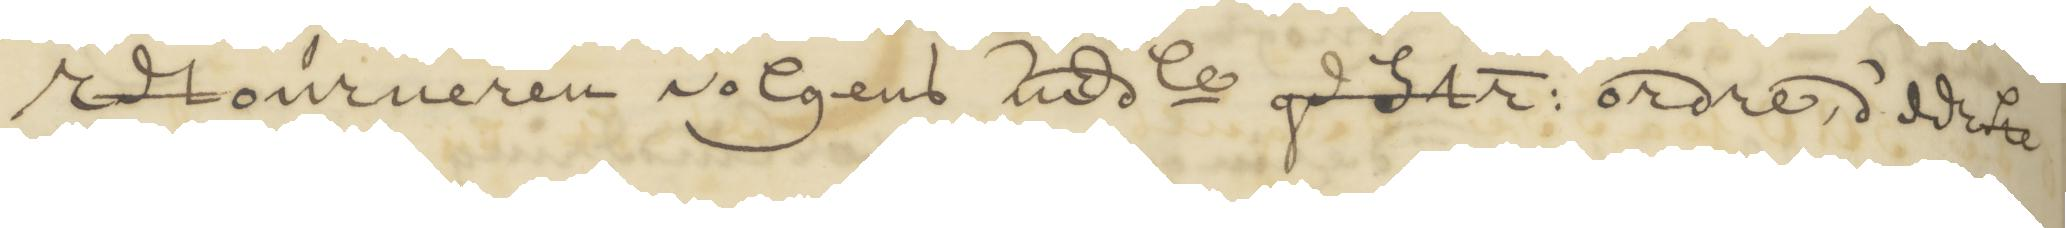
retourneren volgens u Ed-le gestr: ordre, d’eerste
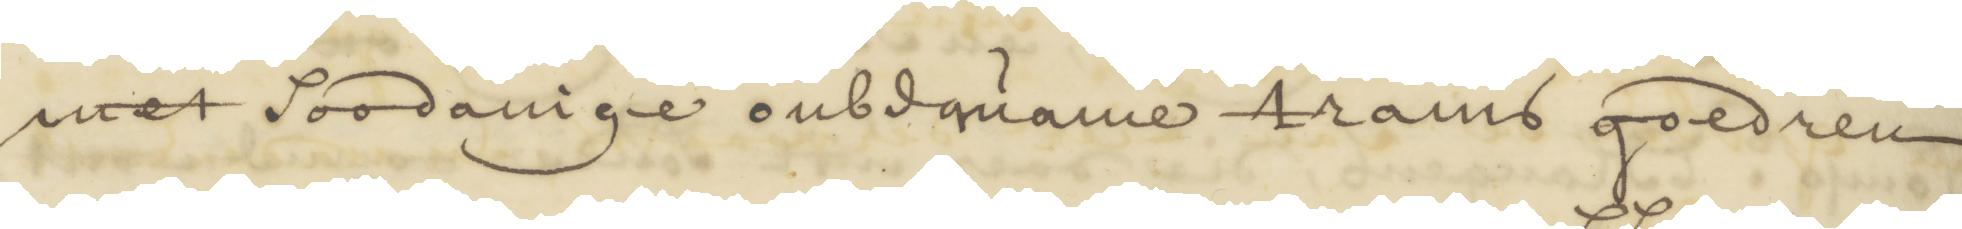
met soodanige onbequame trains goedren
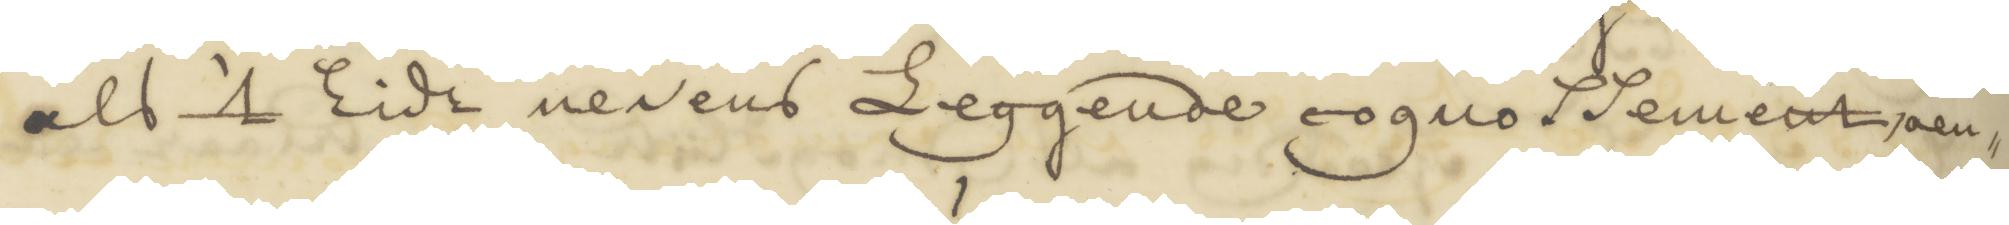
als ’t hier nevens leggende cognossement, aen
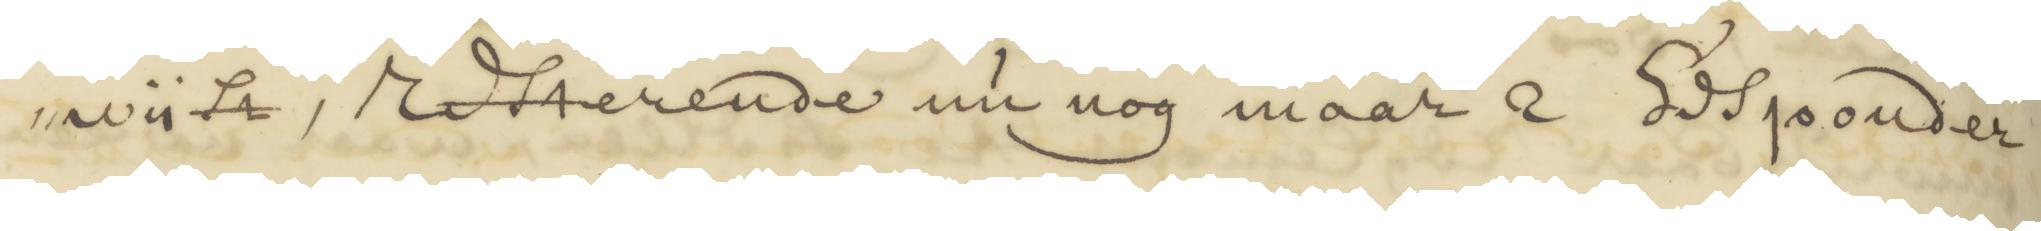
„wijst, resterende nu nog maar 2 s'esponder
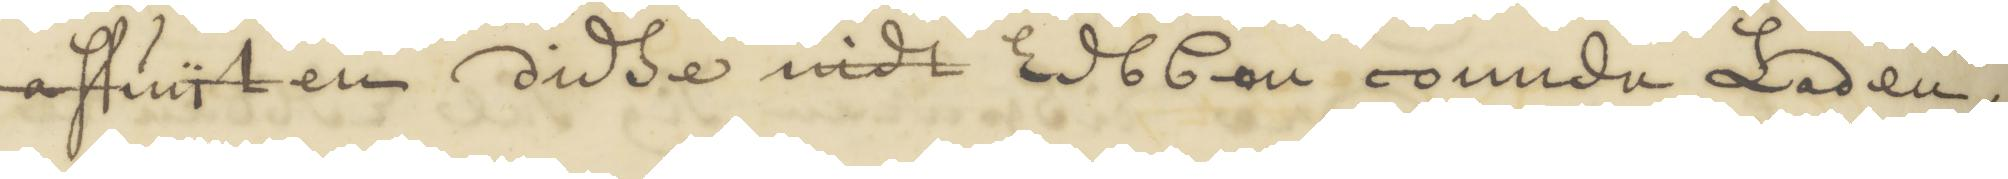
affuijten diese niet hebben connen Laden,
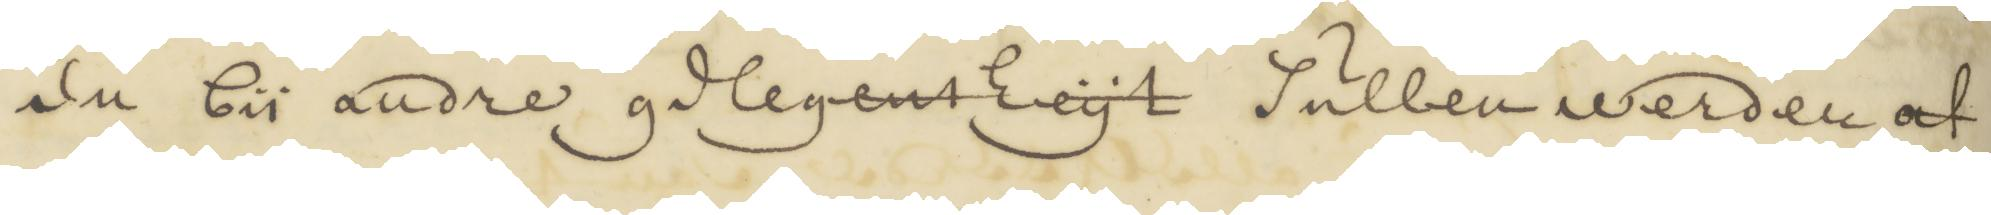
en bij andre gelegentheijt sullen werden af
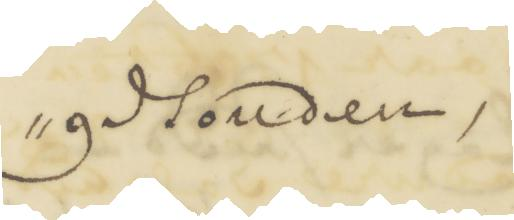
„gesonden,
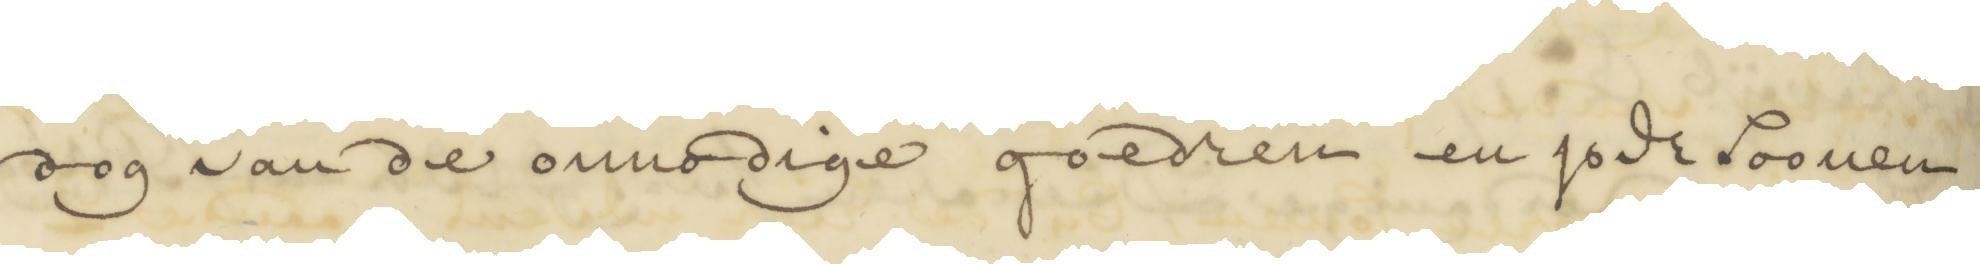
dog van de onnodige goedren en persoonen
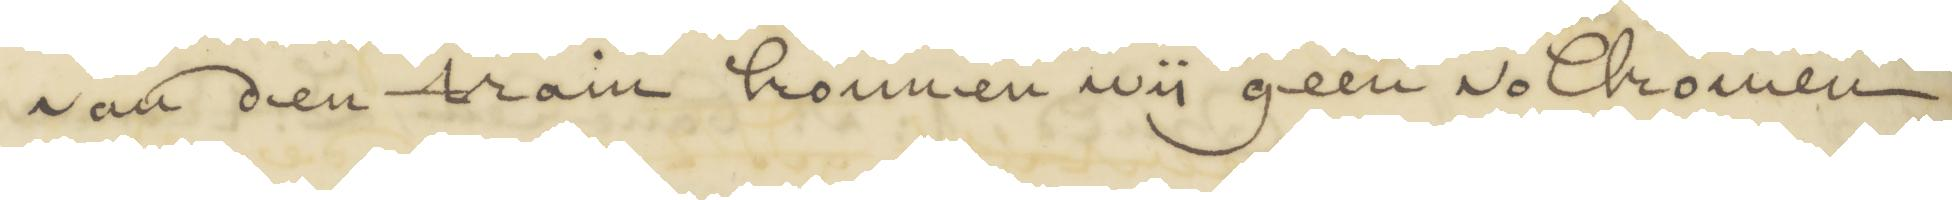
van den train konnen wij geen volkomen
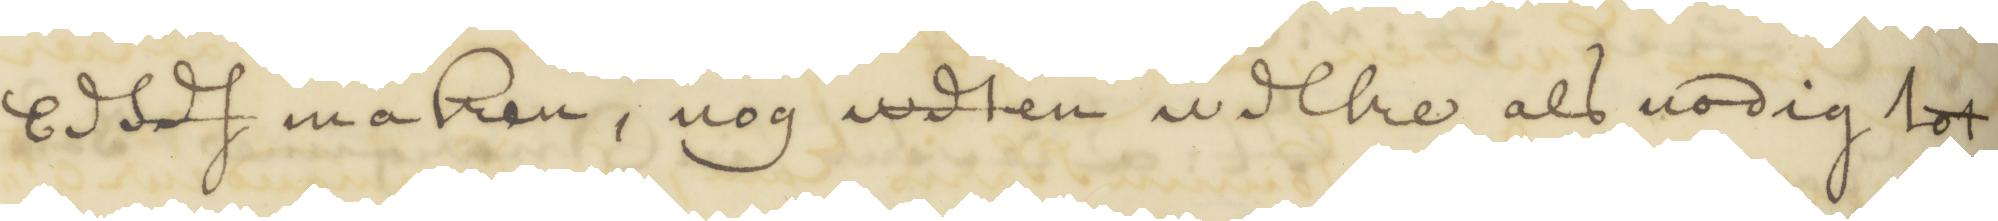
besef maken, nog weten welke als nodig tot
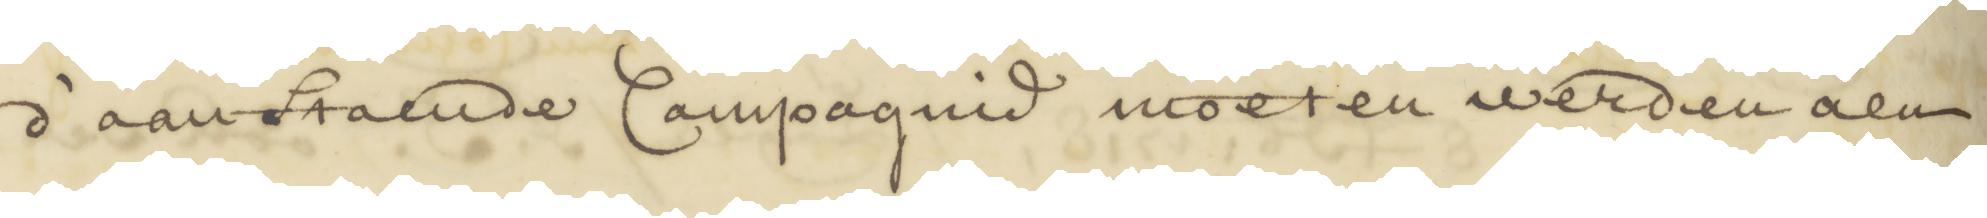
d’ aanstaende Compagnie moeten werden aen
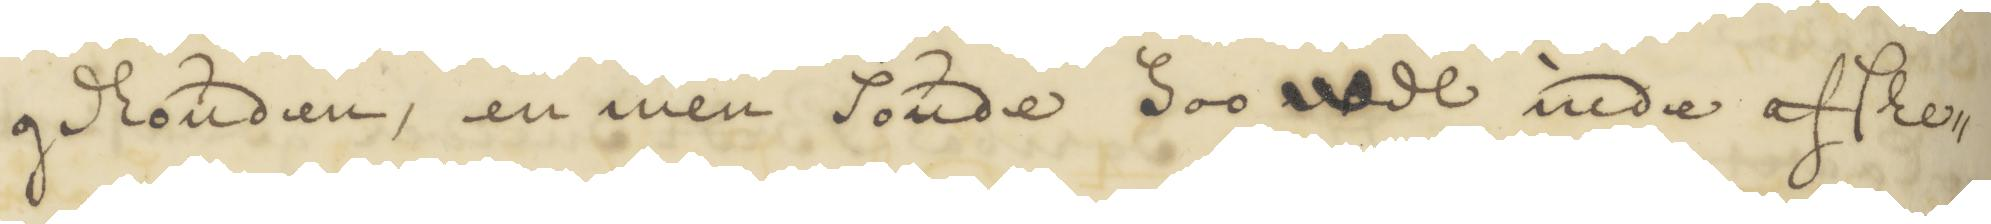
gehouden, en men soude soo wel inde afshe„
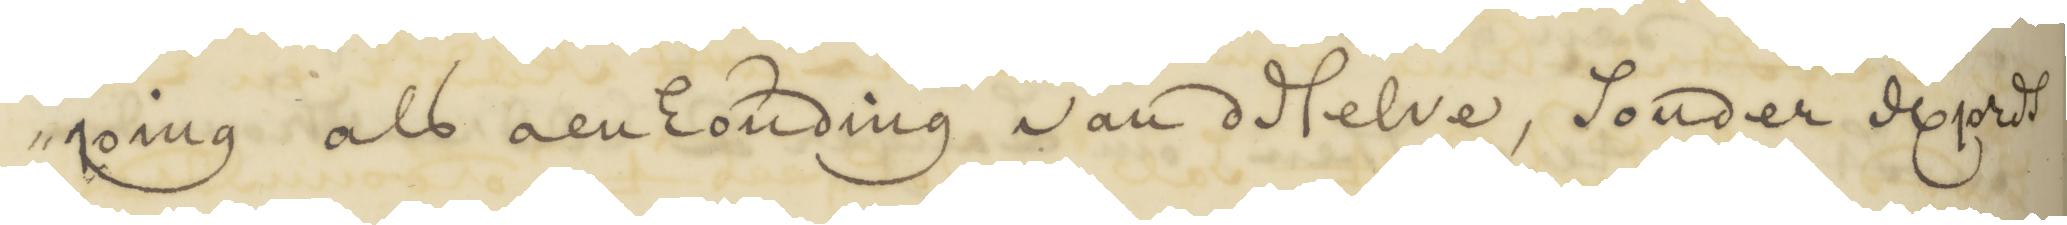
„ping als aenhouding van deselve, sonder expres
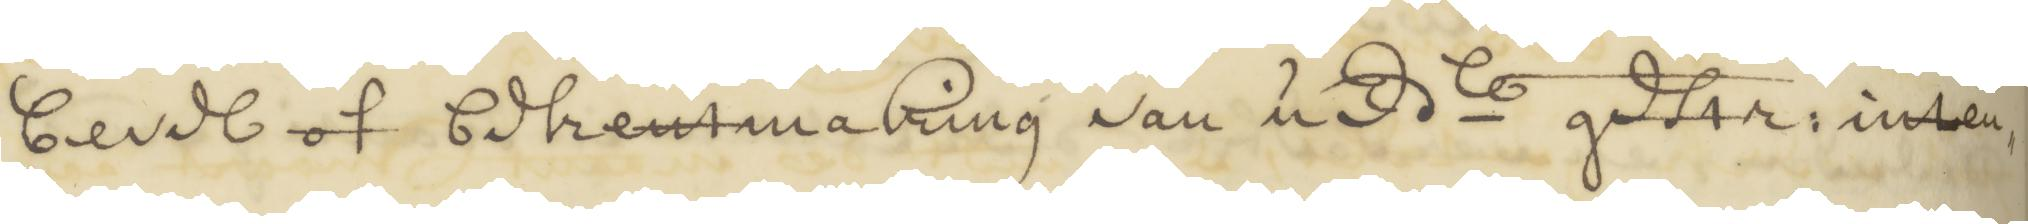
bevel of bekentmaking van u Ed-le gestr: inten
